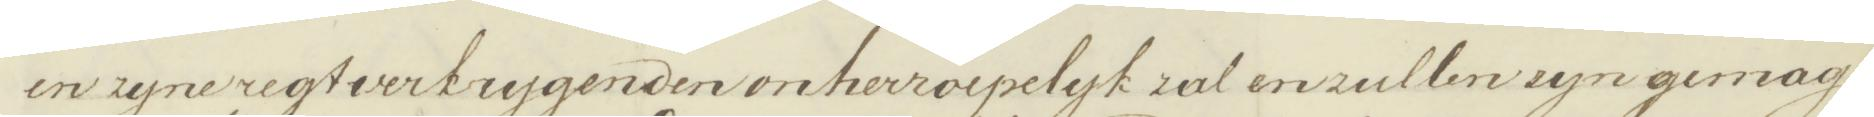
en zyne regt verkrygenden onherroepeljk zal en zullen zyn gemag
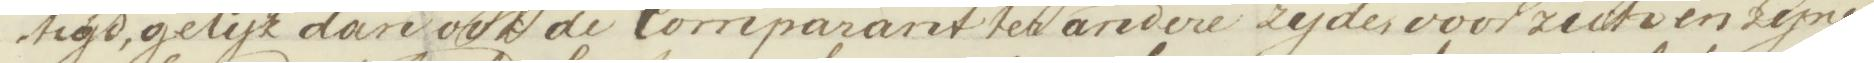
tigd, gelijk dan ook de Comparant ter andere zyde voor zich en zyne
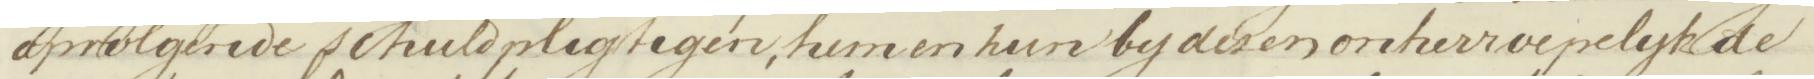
opvolgende schuldpligtigen, hem en hun by dezen onherroepelyk de
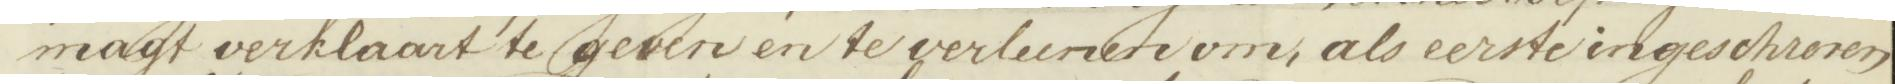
magt verklaart te geven en te verleenen om, als eerste ingeschreven
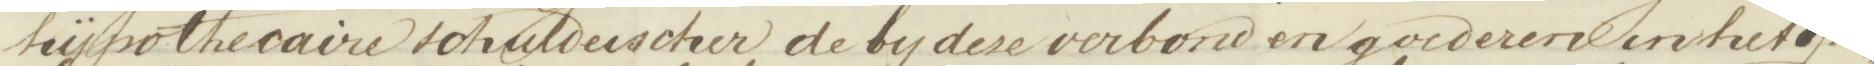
hijpothecaire schuldeischer de by deze verbond en goederen in het open„
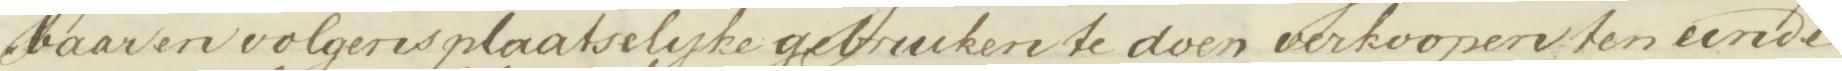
„baar en volgens plaatselyke gebruiken te doen verkoopen ten einde
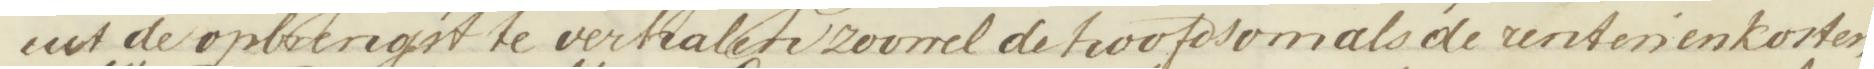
uit de opbrengst te verhalen zoowel de hoofdsom als de renten en kosten:
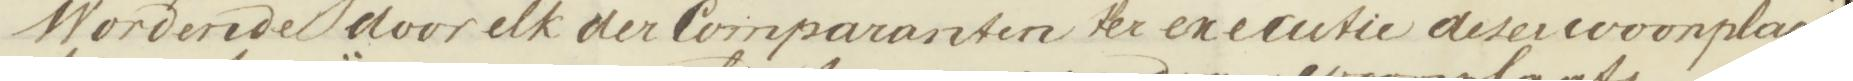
Wordende door elk der Comparanten ter executie dezer woonplaats
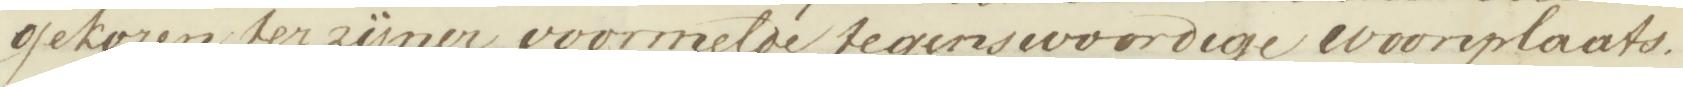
gekozen ter zijner voormelde tegenswoordige woonplaats.
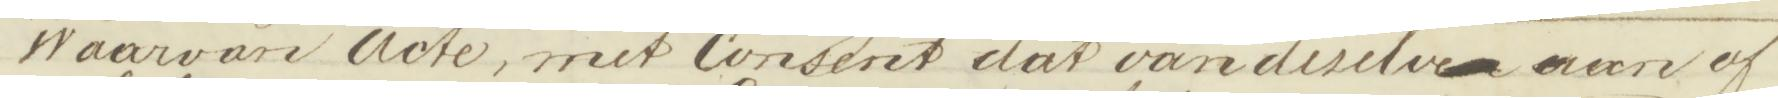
Waarvan Acte, met consent dat van dezelve aan of
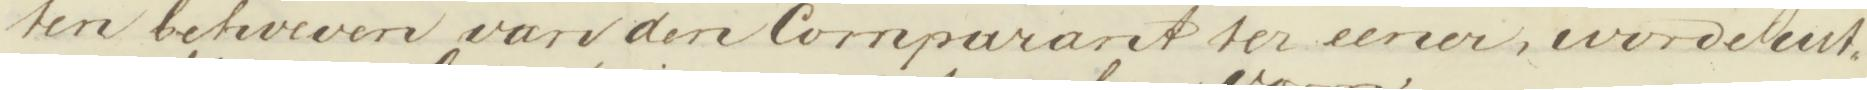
ten behoeven van den Comparant ter eener, worde uit„
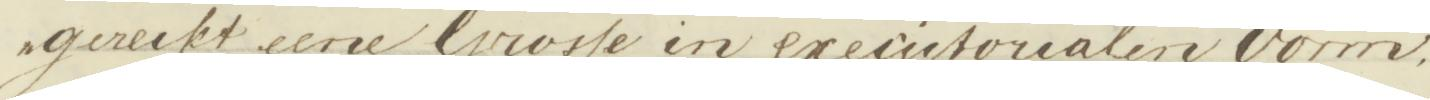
„gereikt eene Grosse in executorialen vorm,
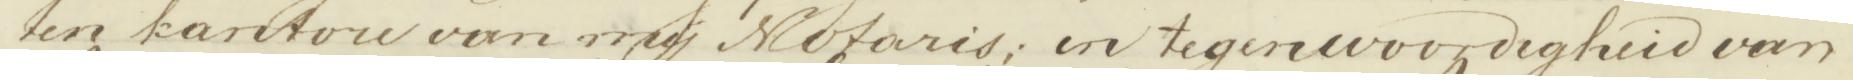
ten kantore van mij Notaris; in tegenwoordigheid van
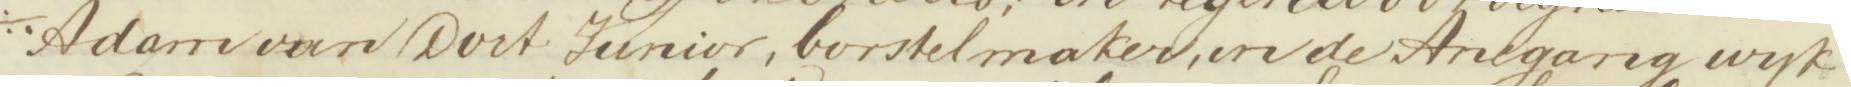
Adam van Dort Junior, borstelmaker, in de Anegang wyk
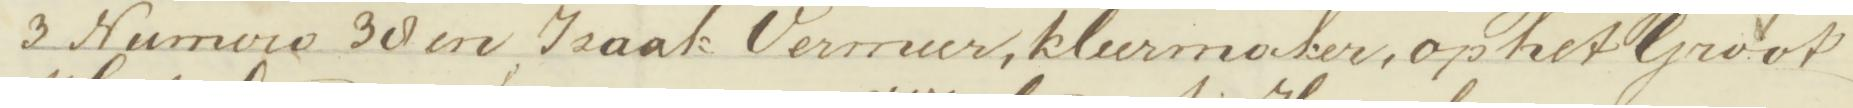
2 Numero 38 en Izaak Vermeer, kleermaker, op het Groot
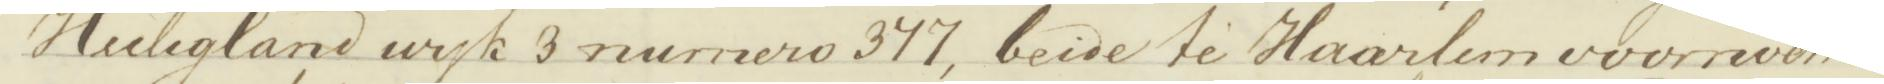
Heiligland wyk 3 numero 377, beide te Haarlem voornoemd
